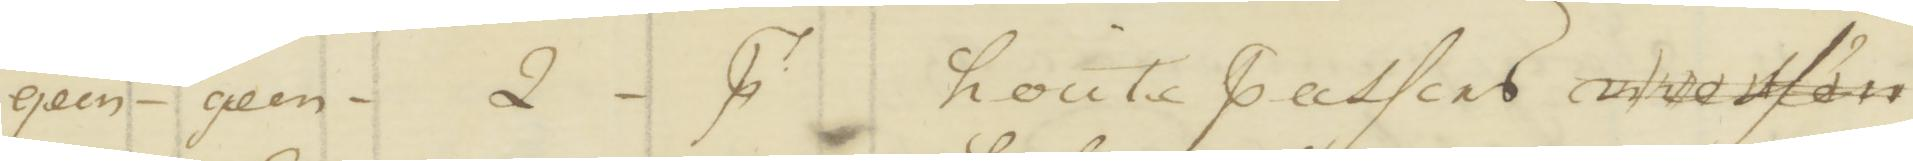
geen – geen – 2 p.s houte passers vtrossen
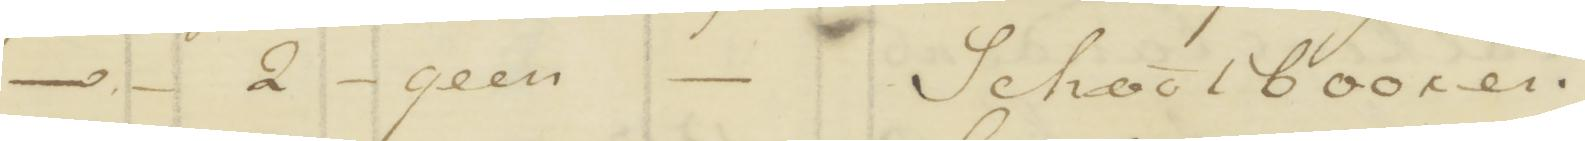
_o. – 2 – geen – Schootbooren.
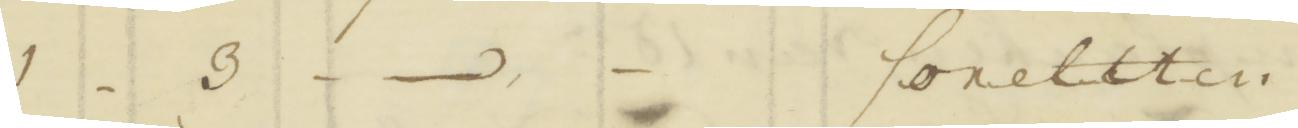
1 – 3 – _o, – sorelaten
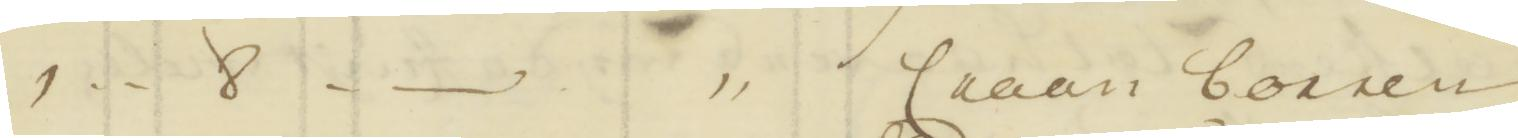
1. – 8 – _o . Craan borren
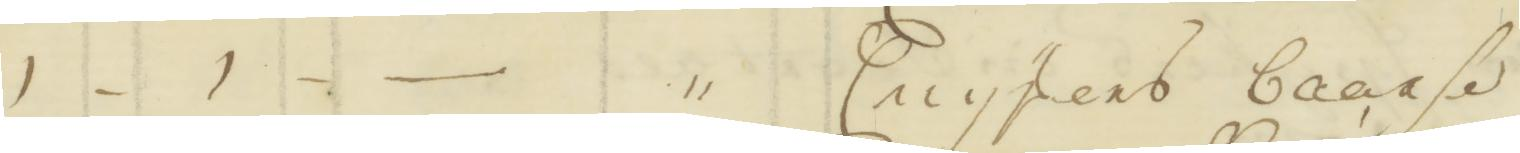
1 – 1 –. _o Cuijpers baarse
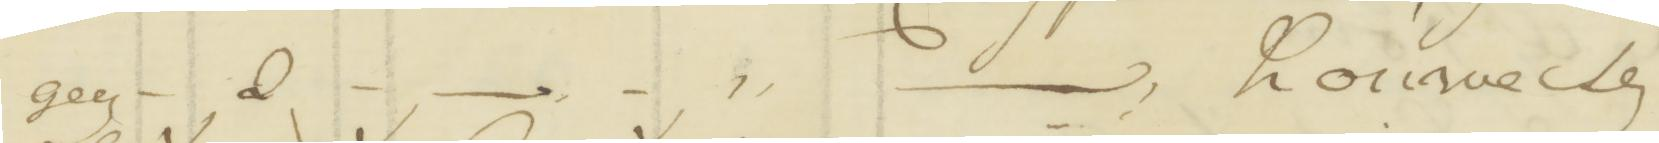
geen – 2 – _,o – „ houweelen
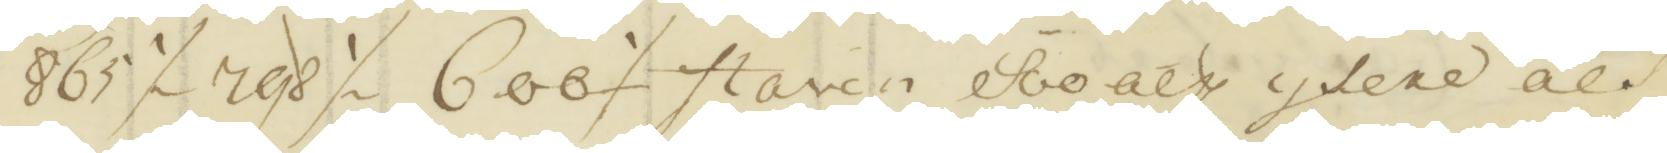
865½ 798½ 600½ staven soo als ysere als
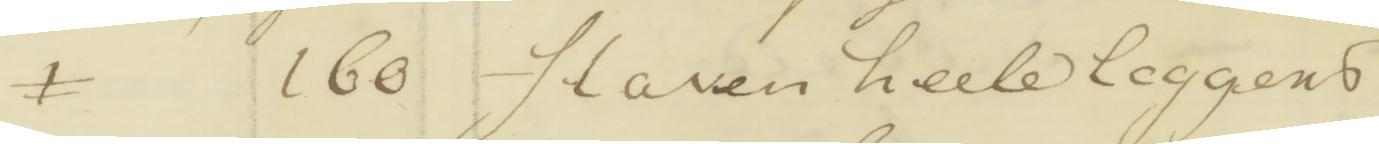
1 160 – staven heele leggers
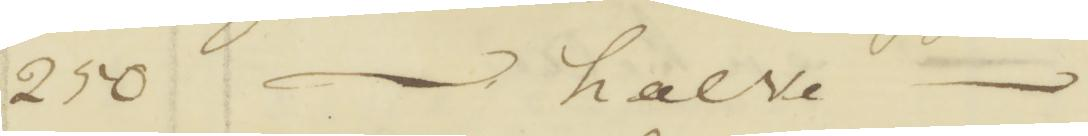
250 _.o halve —
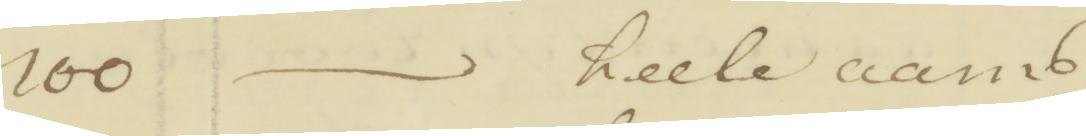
100 _o heele aams
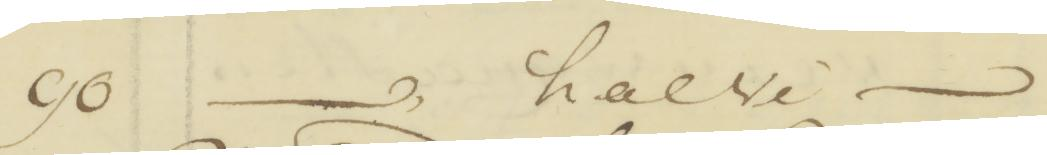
90 _.o halve —
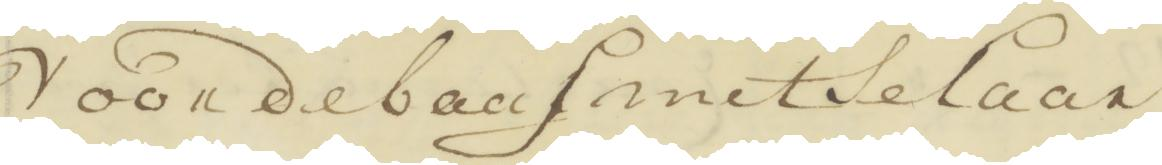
Voor de baasmetselaar
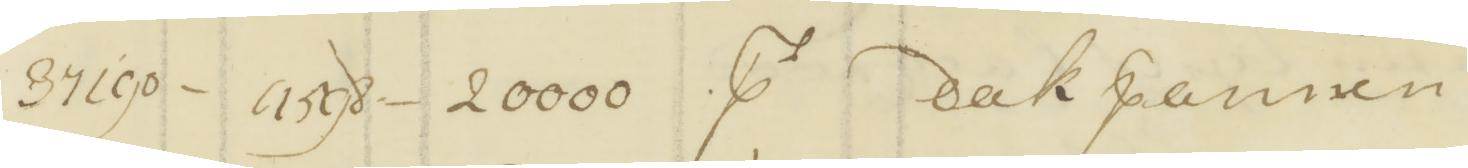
37190 – 4598. – 20000 ps dak pannen
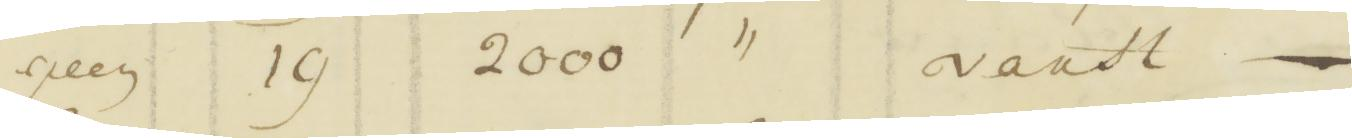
geen 19 2000 „ vorst _
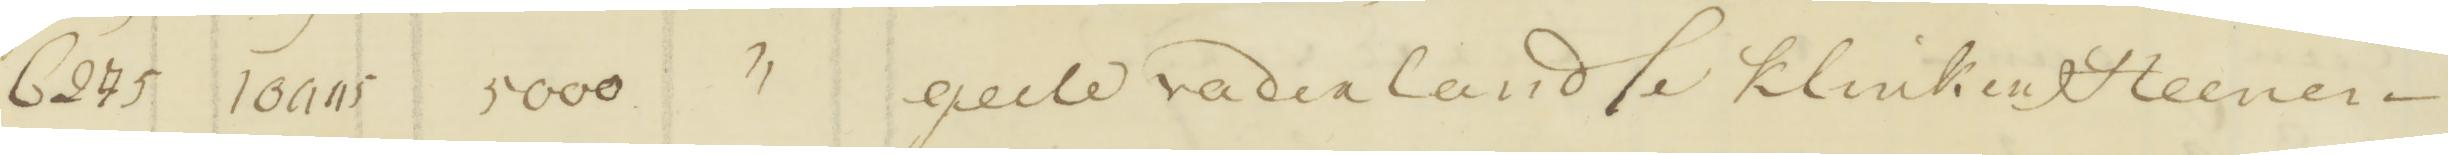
6275 10445 5000 „ geele vaderlandse klinker Steenen —
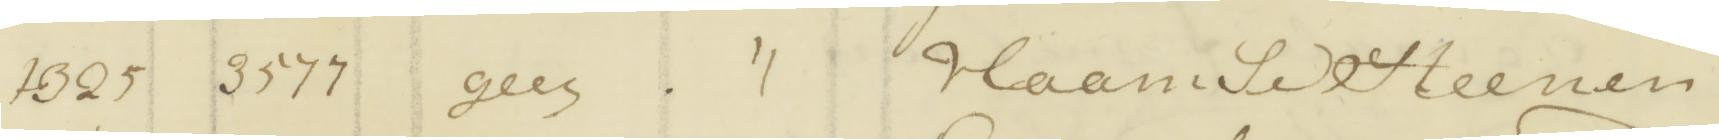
1325 3577 geen . „ vlaamse Steenen
